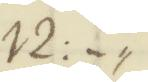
12: – „
